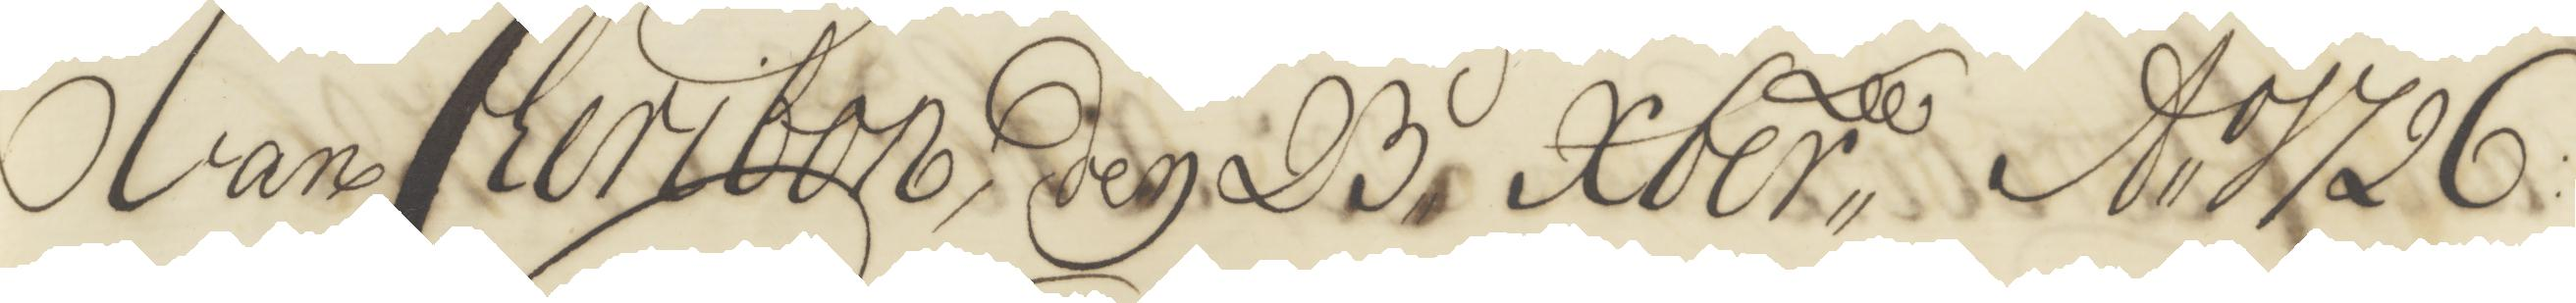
Van Cheribon, den 23„e xber„ A„o 1726:
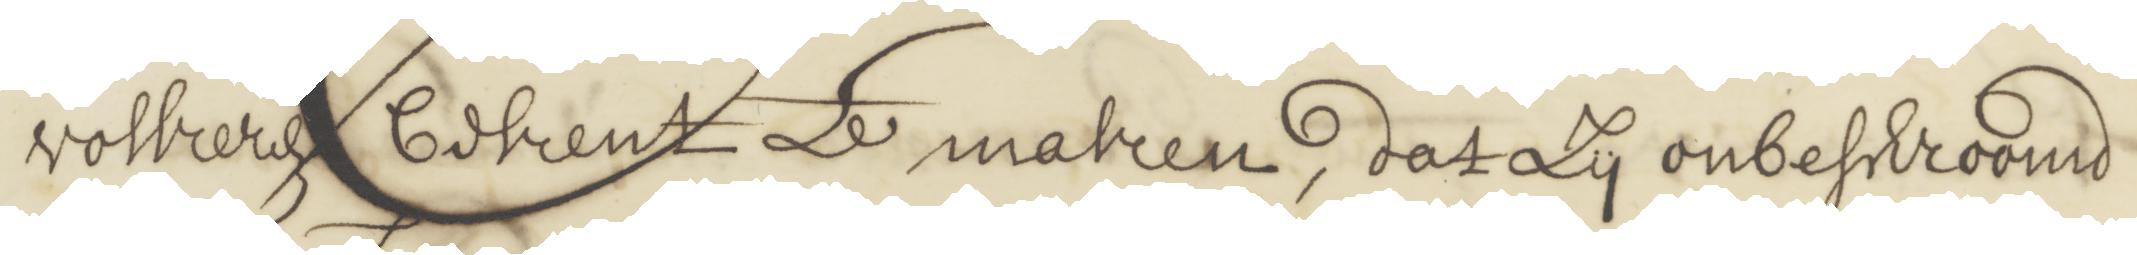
volkeren bekent te maken, dat zij onbeschroomd
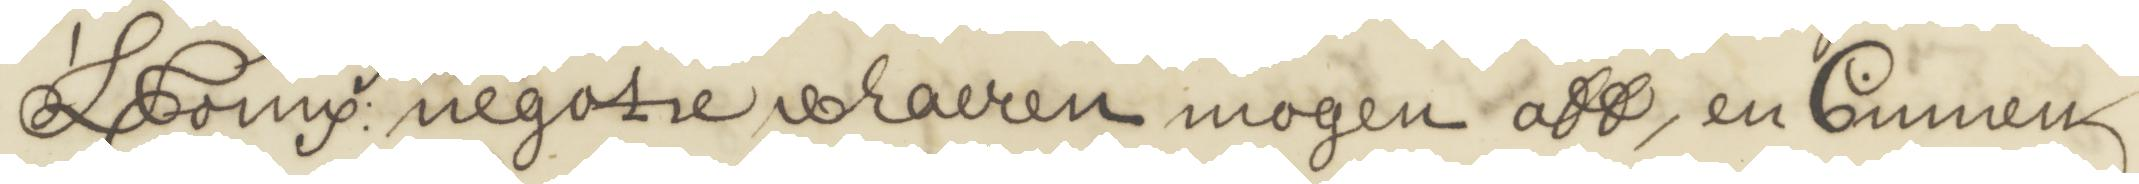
d'EComp:s negotie whaeren mogen aff, en binnen
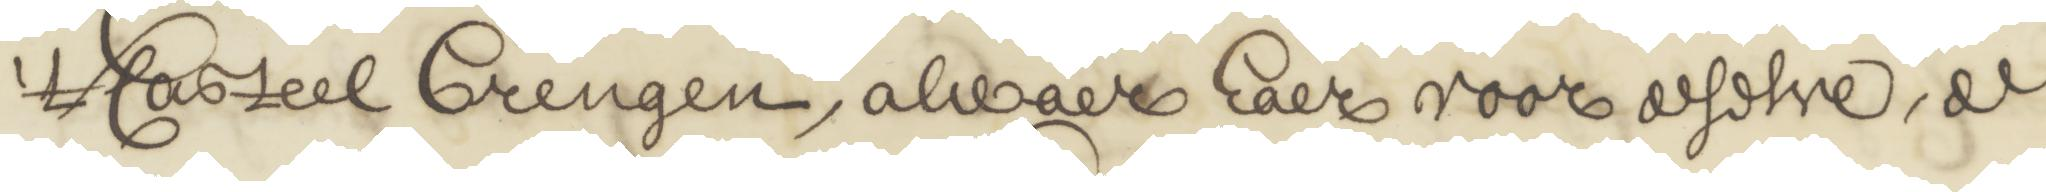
't Casteel brengen, alwaer haer voor deselve, de
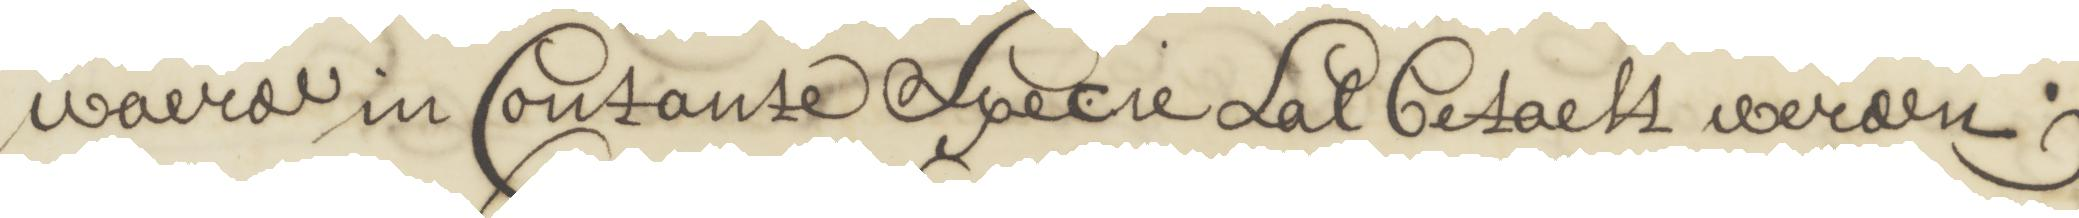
waerde in Contante Specie sal betaelt werden;
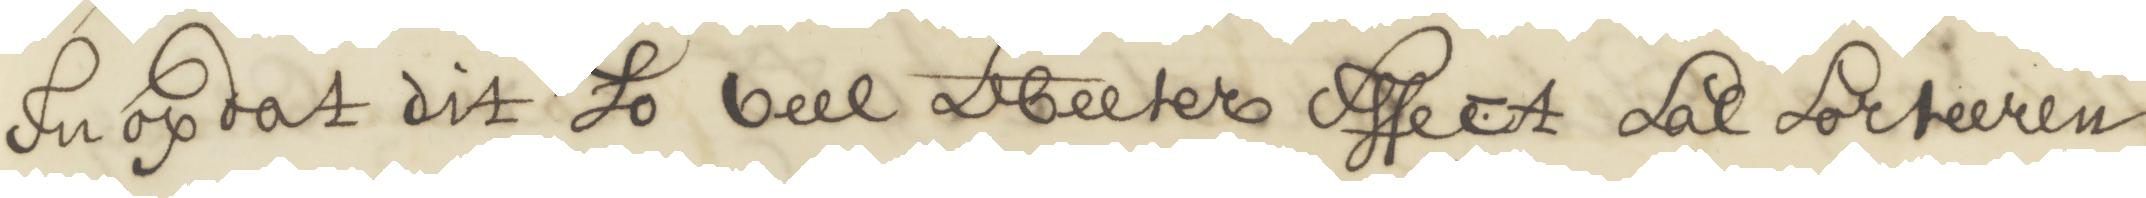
En op dat dit so veel te beeter Effect sal sorteeren,
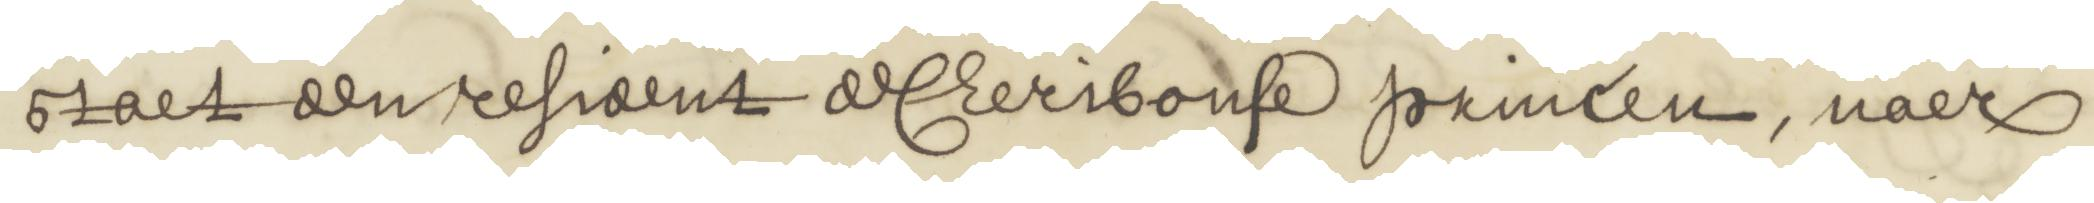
staet den resident de Cheribonse princen, naer
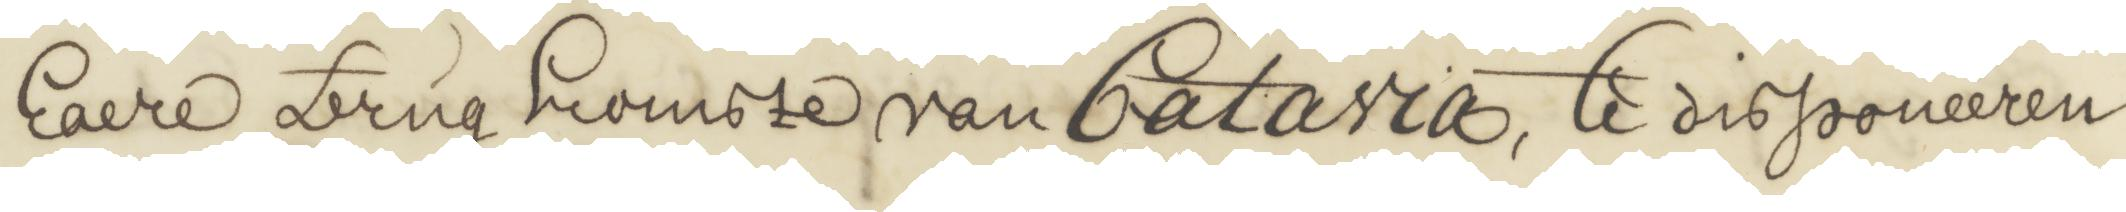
haere terug komste van batavia, te disponeeren
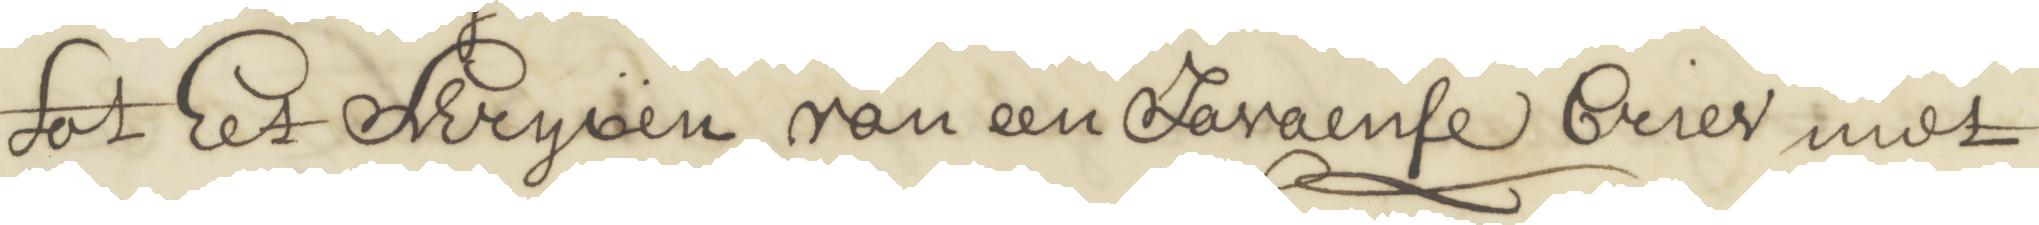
tot het schryven van een Iavaense briev met
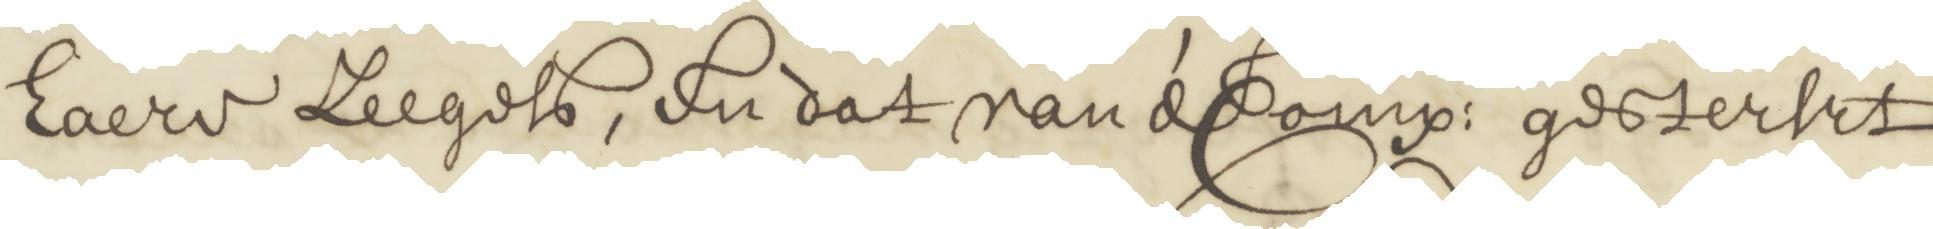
haere zeegels, En dat van d'EComp: gesterkt,
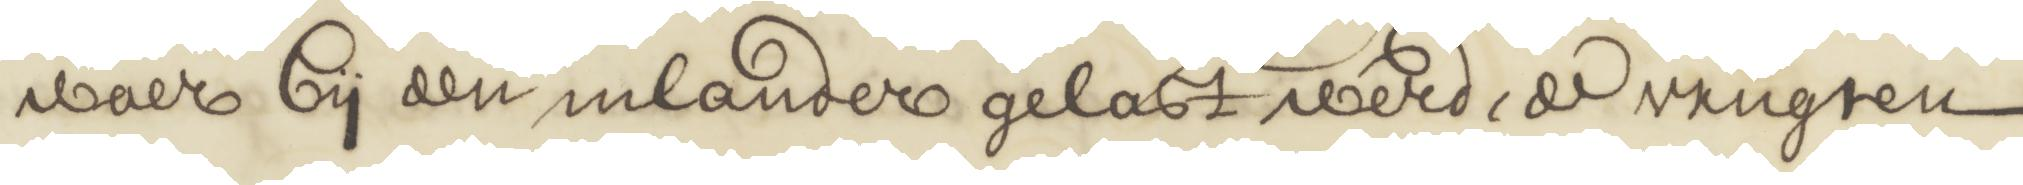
waer bij den inlander gelast werd, de vrugten
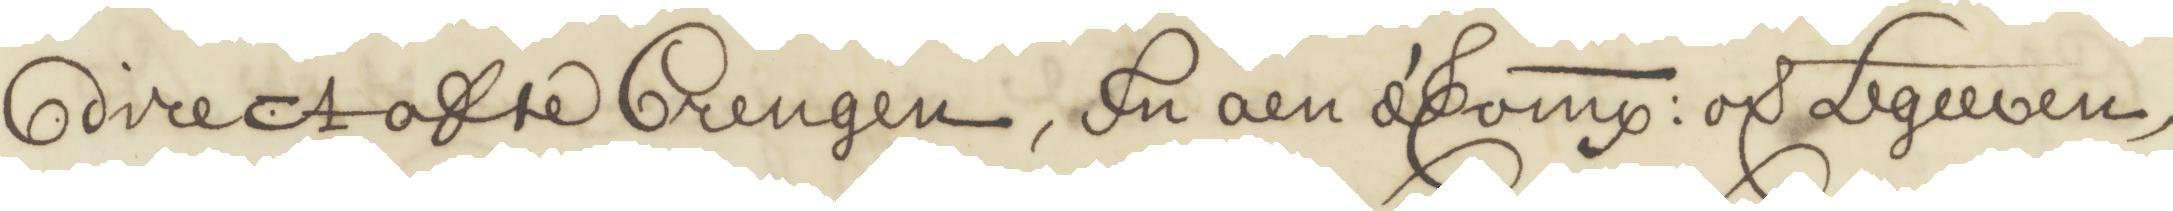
direct af te brengen, En aen d'EComp: over tegeeven,
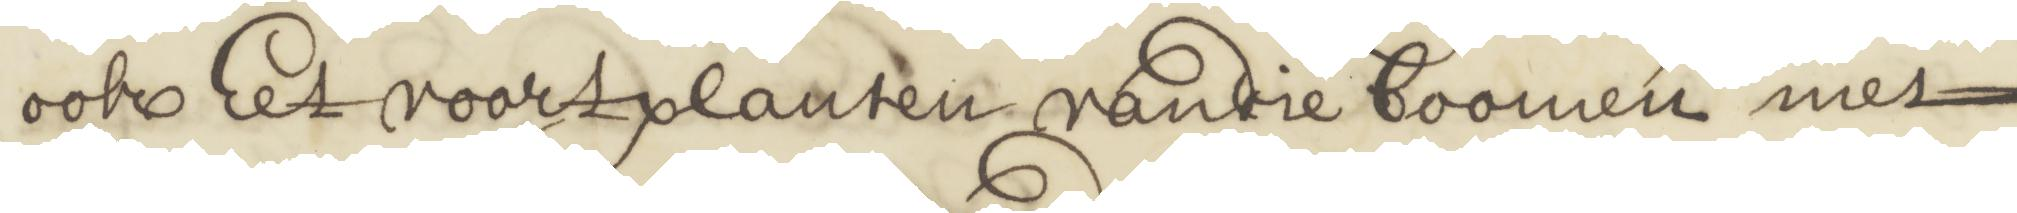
ook het voortplanten van die boomen met
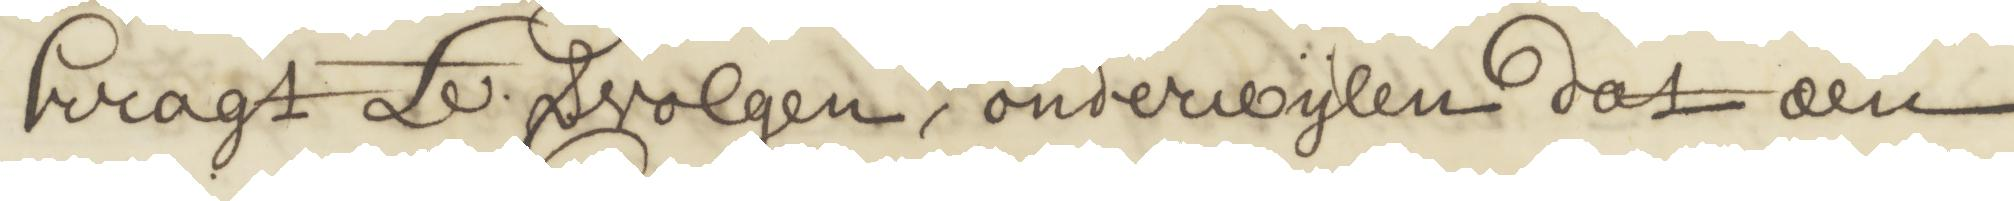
kragt te vervolgen, onderwijlen dat den
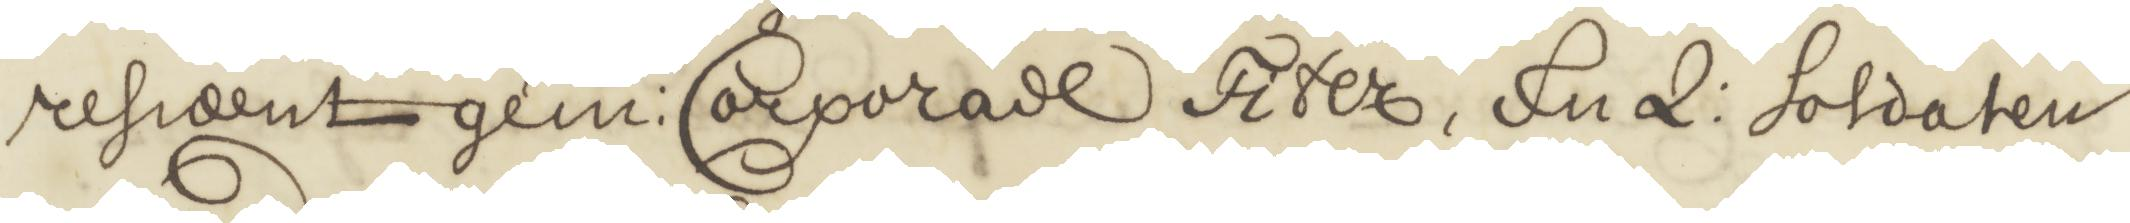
resident gem: Corporael Fiter, En 2: soldaten
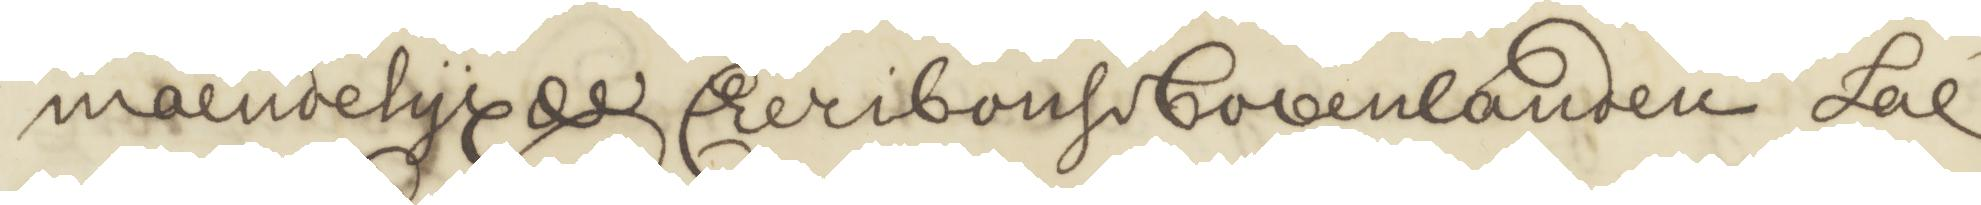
maendelijx de Cheribonse bovenlanden sal
